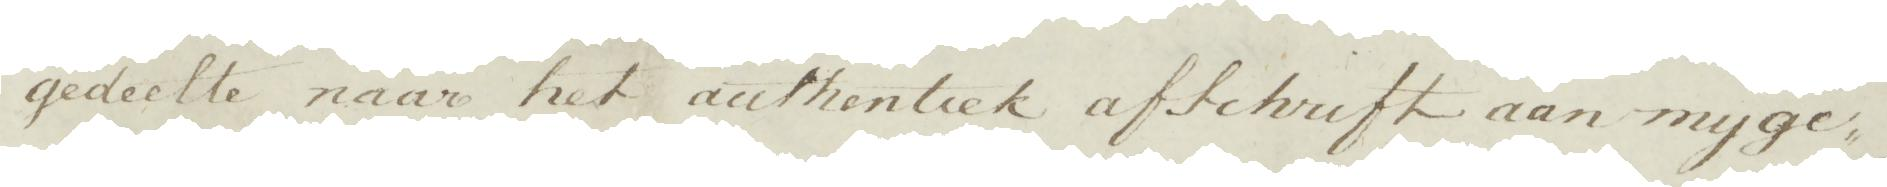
gedeelte naar het authentiek afschrift aan my ge„
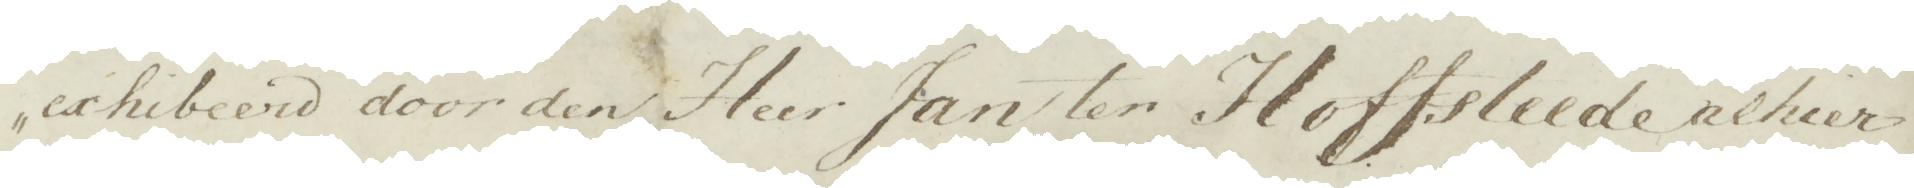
„exhibeerd door den Heer Jan ter Hoffsteede alhier
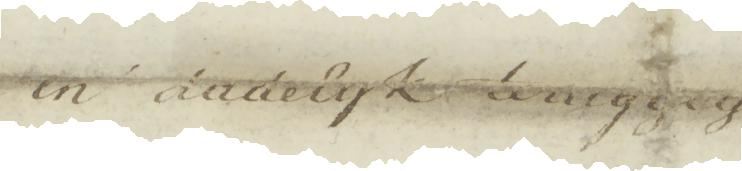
en dadelyk terug gegeven
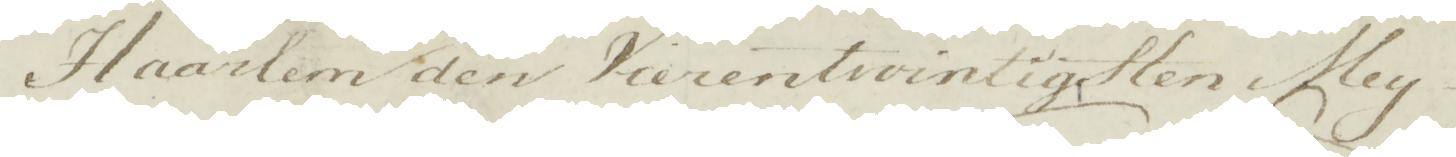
Haarlem den Vierentwintigsten Mey
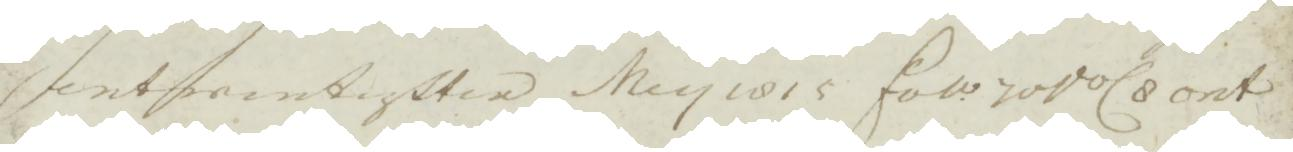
en twintigsten Mey 1815 fol.o 10 N:o C8 ont-
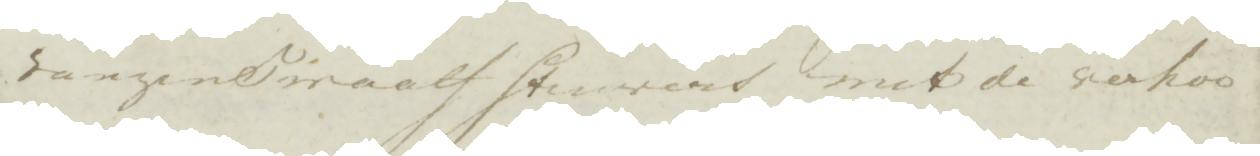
vangen Twaalf Stuivers met de verhoo
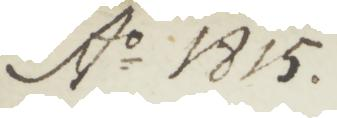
A=o 1815.
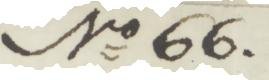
N=o 66.
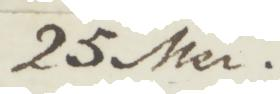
25 Mei.
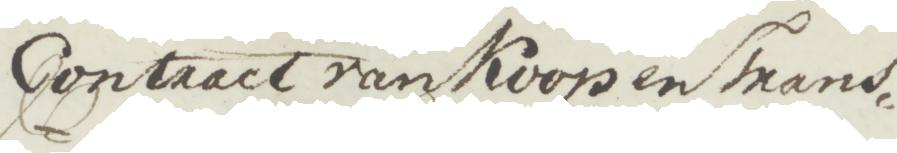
Contract van Koop en Trans„
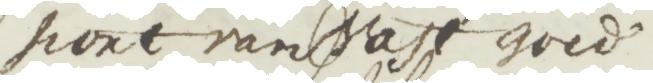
port van Vast goed
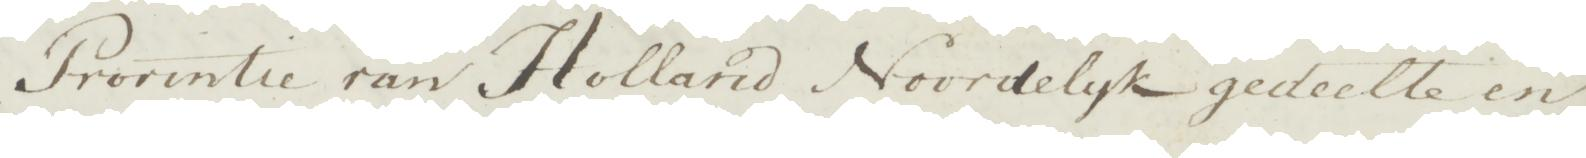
Provintie van Holland Noordelyk gedeelte en
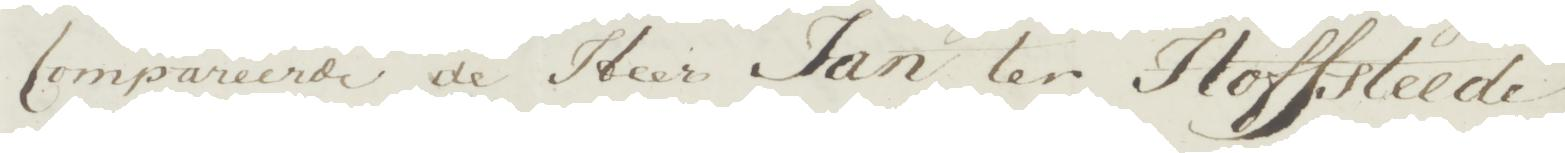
Compareerde de Heer Ian ter Hoffsteede
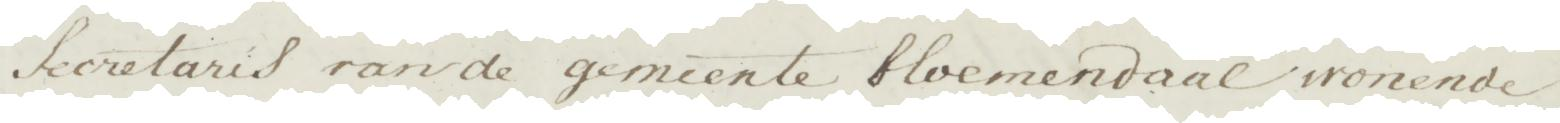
Secretaris van de gemeente bloemendaal wonende
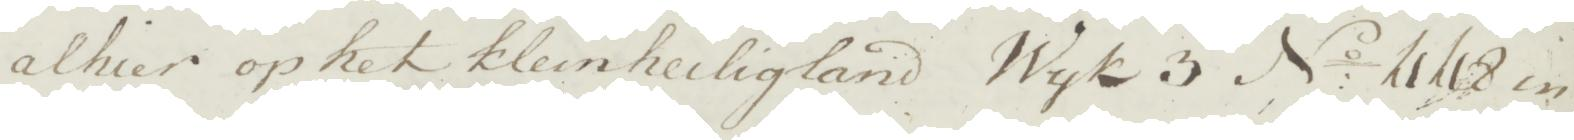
alhier op het klein heiligland, Wyk 3 N:o 448 in
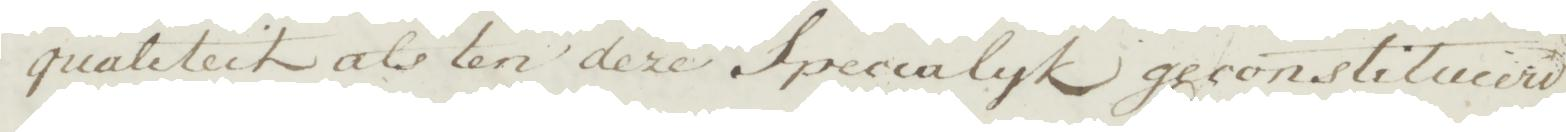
qualiteit als ten deze Specialyk geconstitueerd
